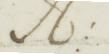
A:
